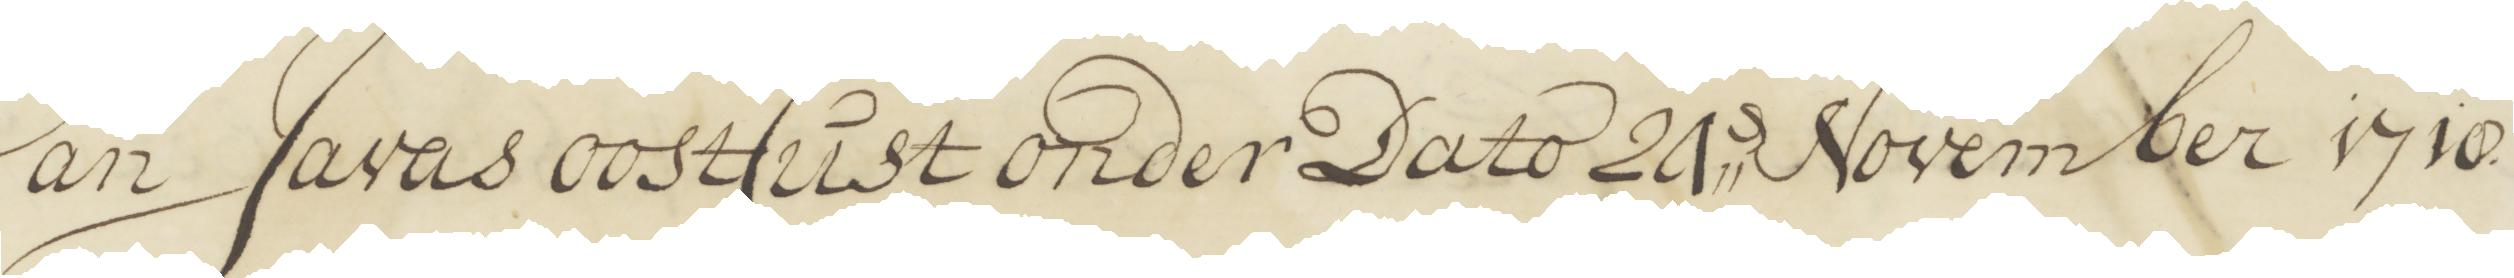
Van Javas oost Cust onder Dato 24„en November 1718.
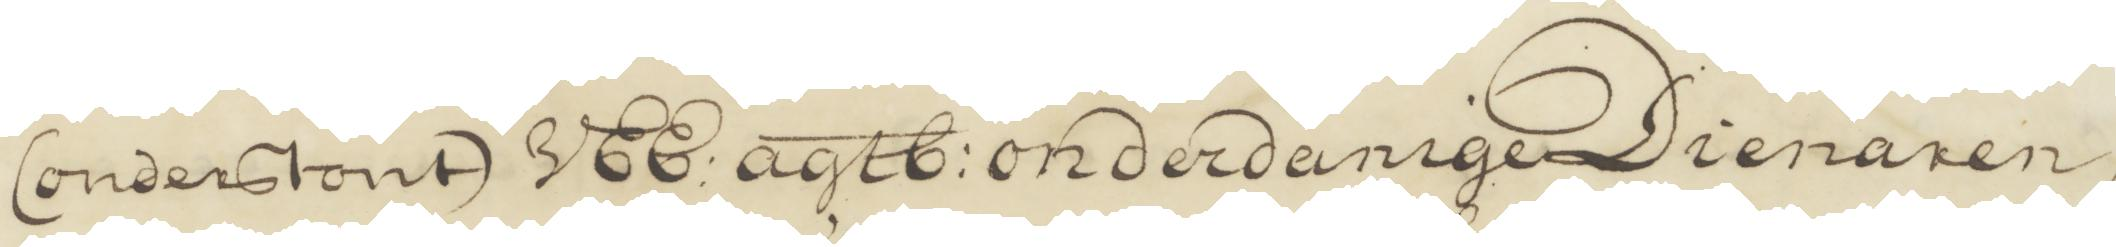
(onderstont) VEE: agtb: onderdanige Dienaren,
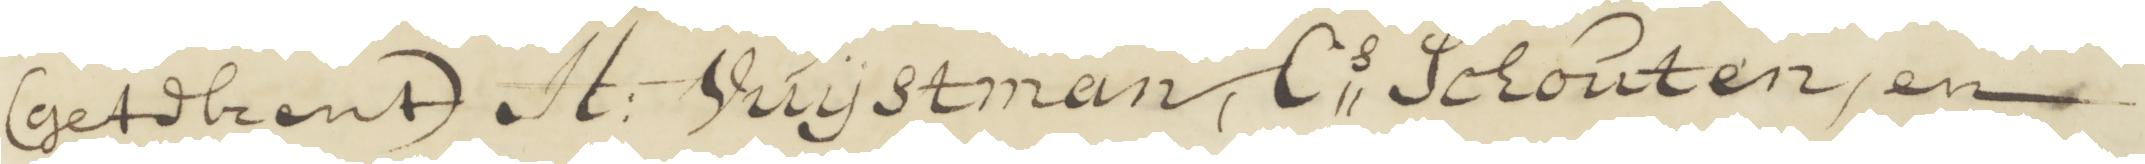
(getekent) H: Vuijstman, C„s schouten, en
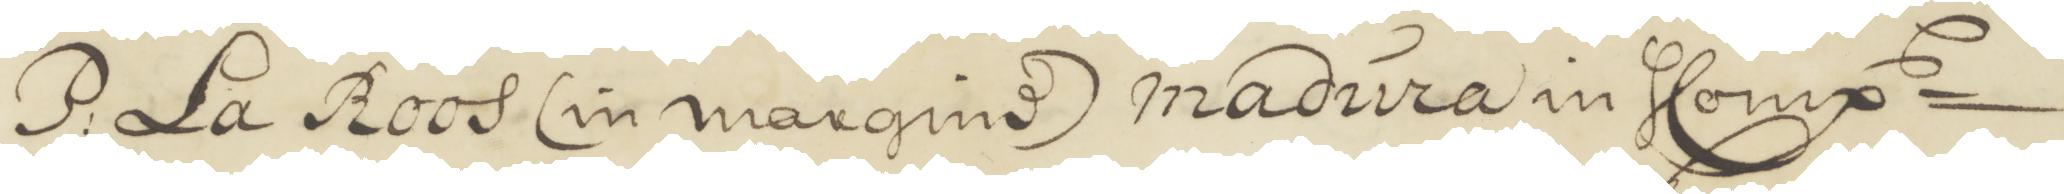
P: La Roos (in margine) madura in SComp=s
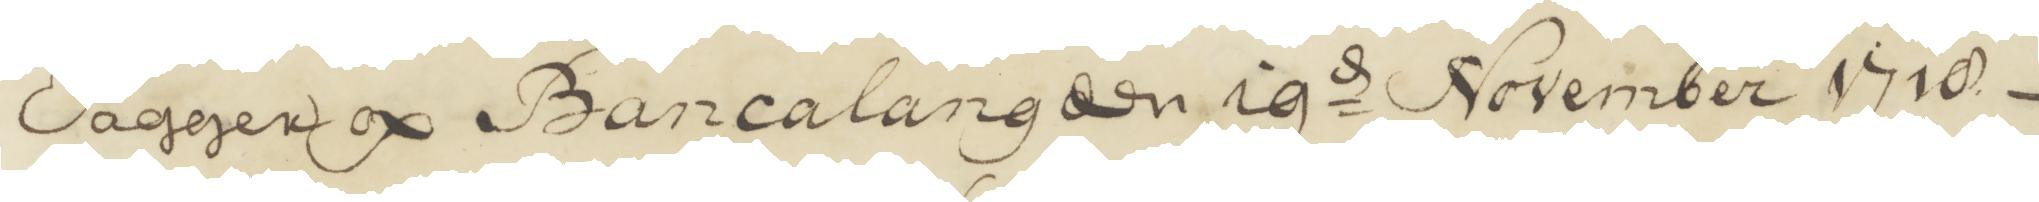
Pagger op Bancalang den 19=en November 1718. —
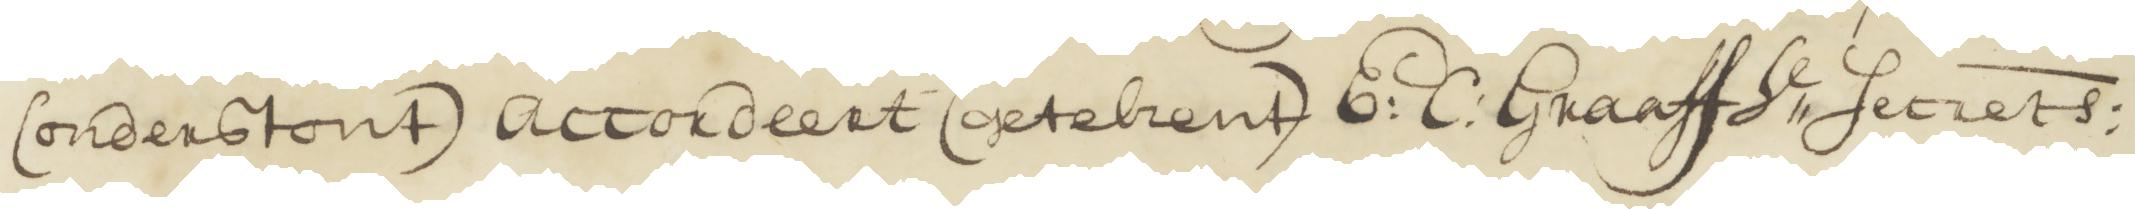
(onderstont) accordeert (getekent) E: C: Graaff h„l „ secrets:
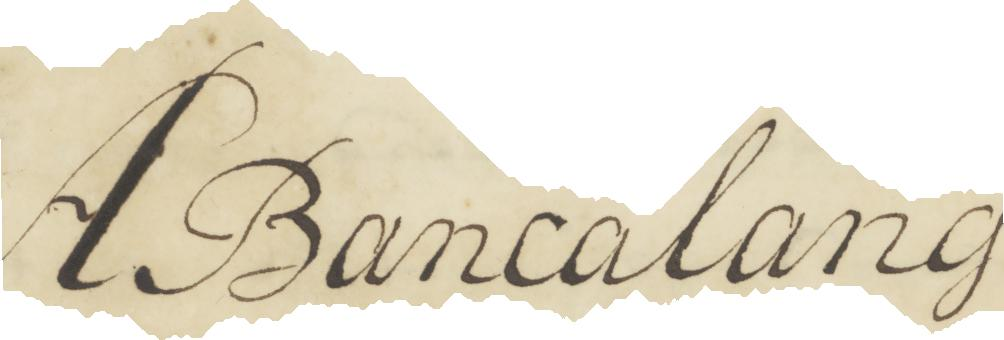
t Bancalang
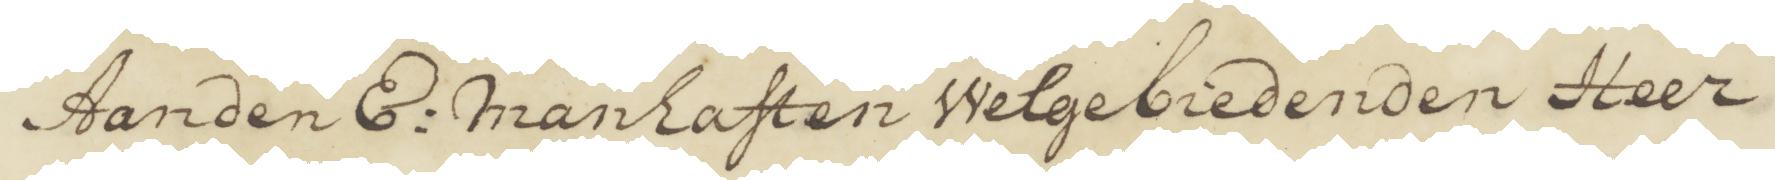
Aan den E: manhaften Welgebiedenden Heer
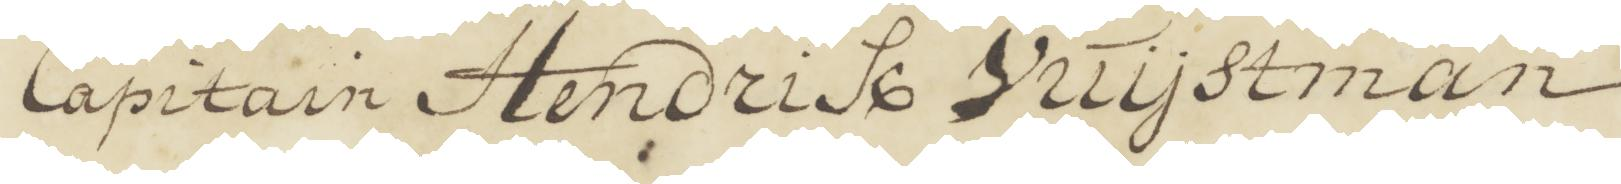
Capitain Hendrik Vuijstman
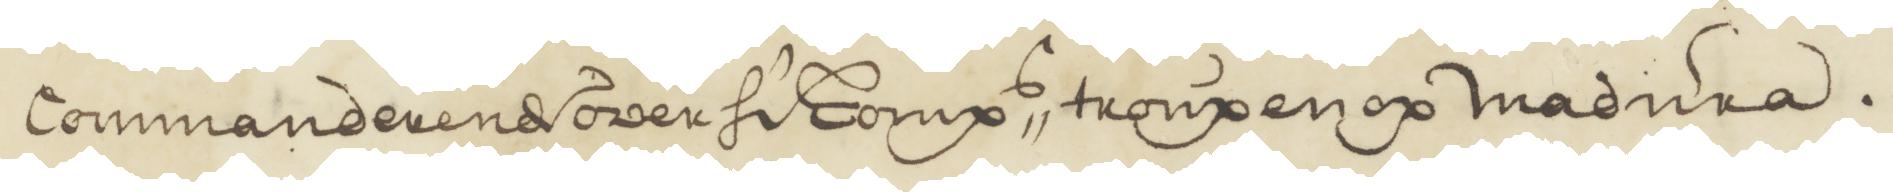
commanderende over s'Ecomp„s troupen op madura.
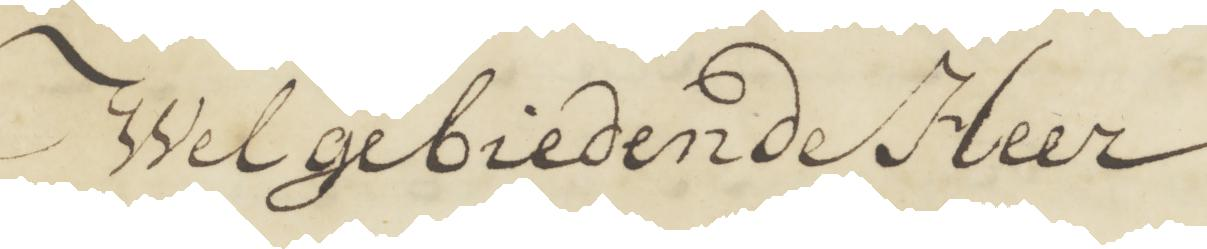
Wel gebiedende Heer.
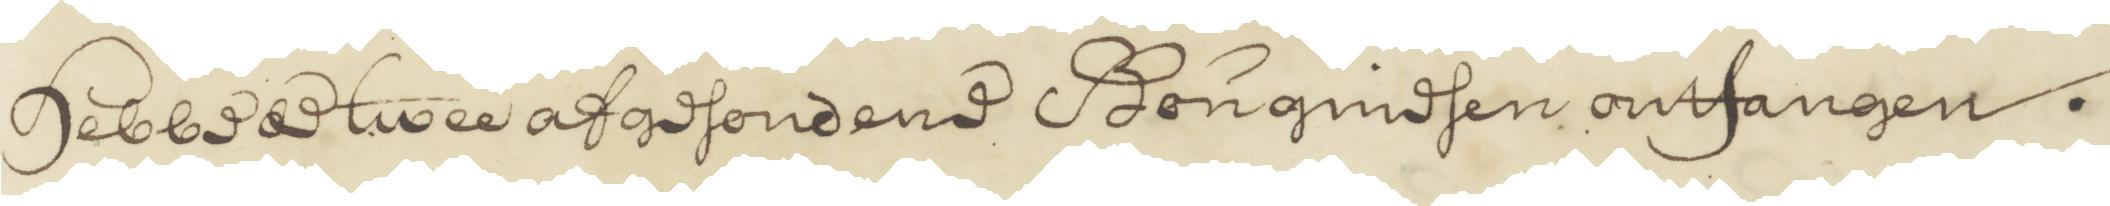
Hebbe de twee afgesondene Bouginesen ontfangen.
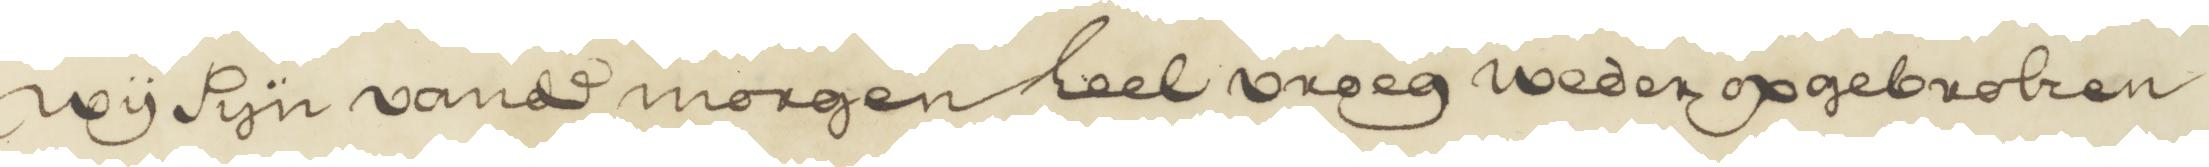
wij sijn vande morgen heel vroeg weder op gebroken
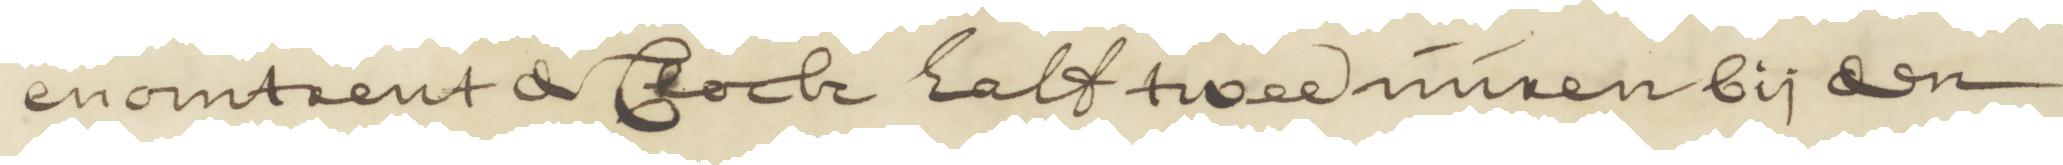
en omtrent de Clock half twee uuren bij den
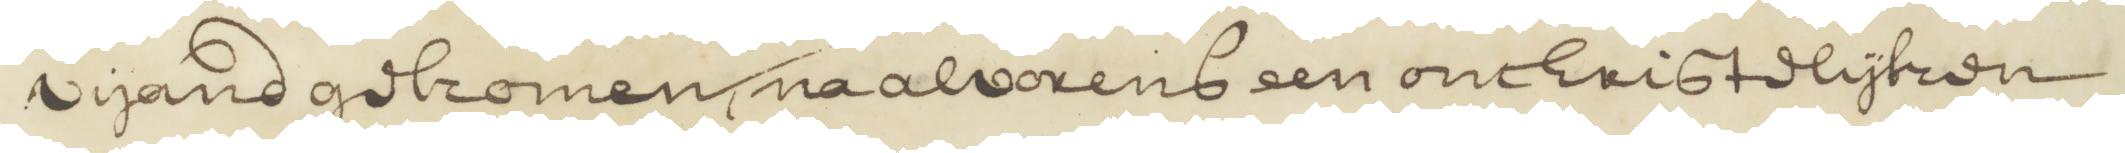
vijand gekomen, na alvorens een onchristelijken
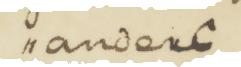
„ anders
